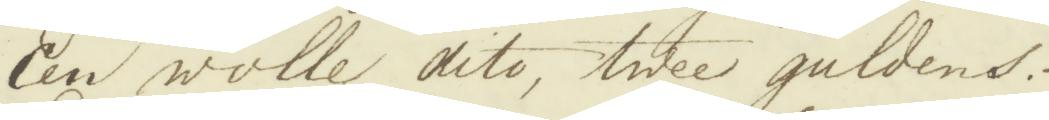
Een wolle dito, twee guldens.
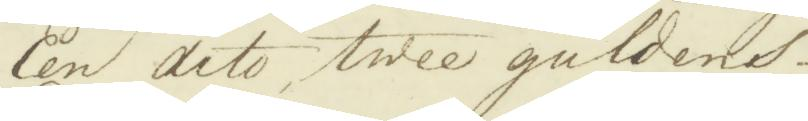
Een dito, twee guldens.
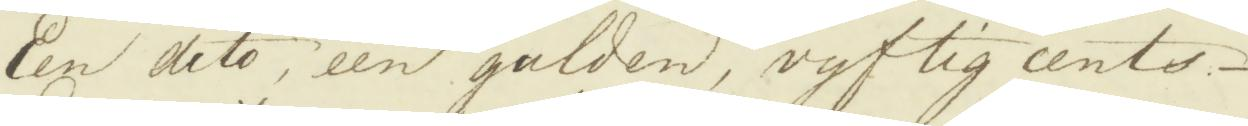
Een dito, een gulden, vijftig cents.-
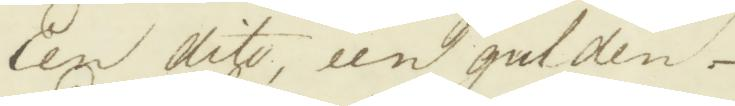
Een dito, een gulden
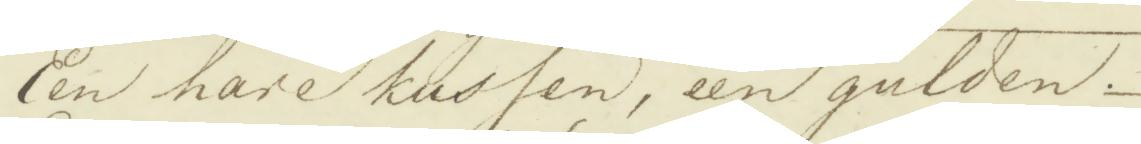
Een hare kussen, een gulden
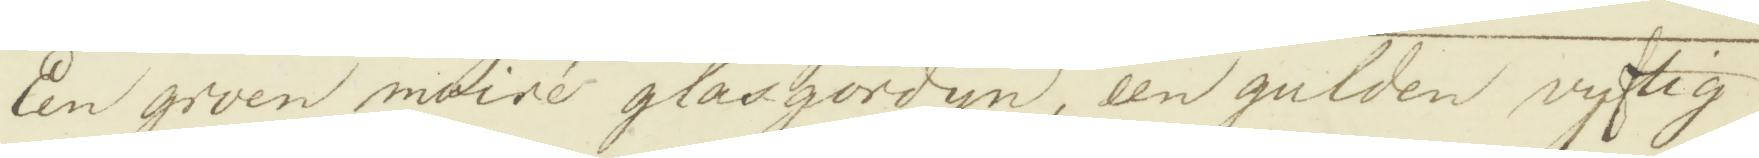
Een groen moiré glasgordyn, een gulden vyftig
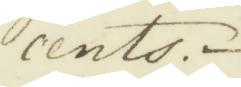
cents.—
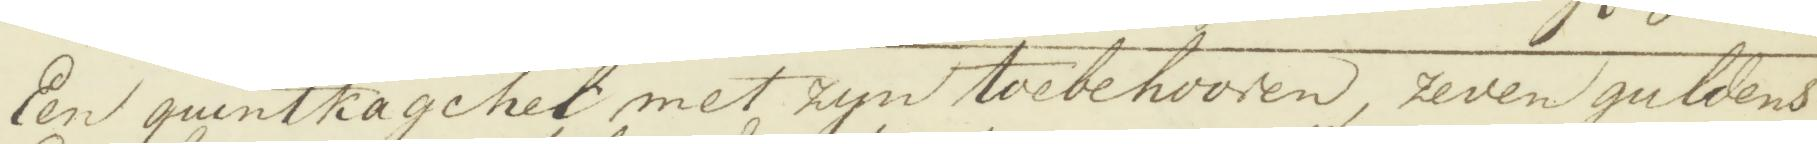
Een quintkagchel met zyn toebehooren, zeven guldens
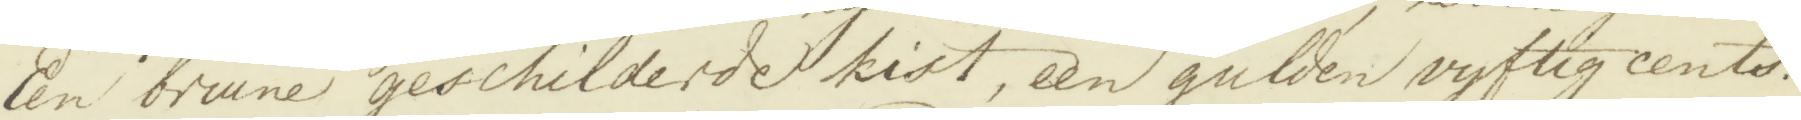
Een bruine geschilderde kist, een gulden vyftig cents.
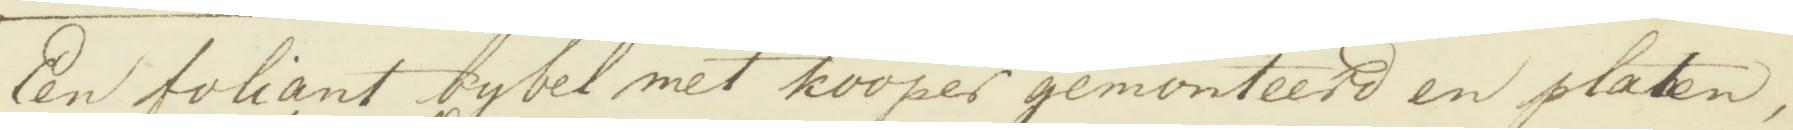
Een foliant bybel met kooper gemonteerd en platen,
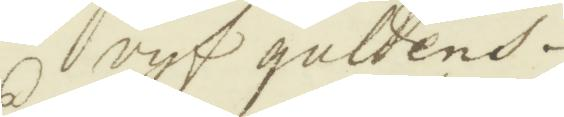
vyf guldens.
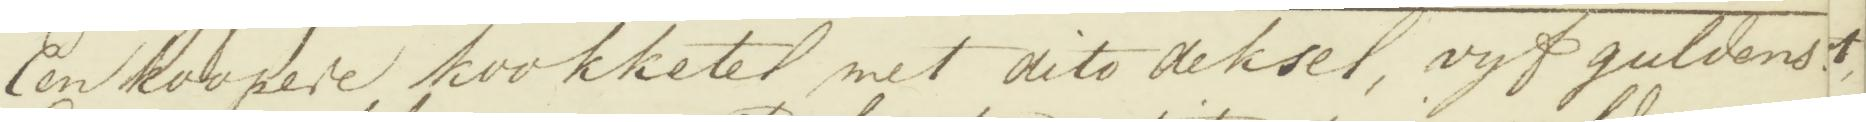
Een koopere kookketel met dito deksel, vijf guldens.
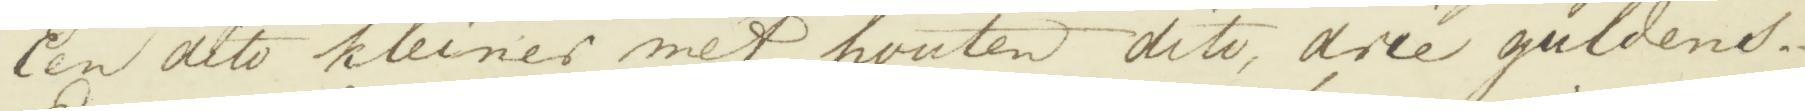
Een dito kleiner met houten dito, drie guldens.
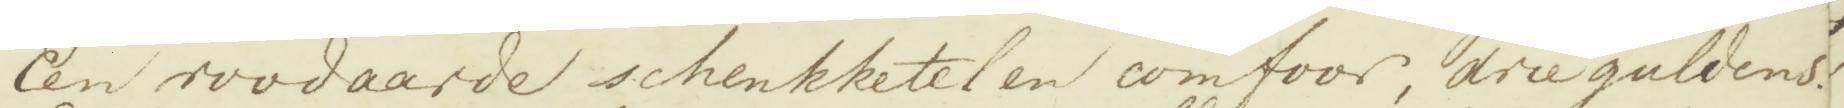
Een roodaarde schenkketel en comfoor, drie guldens
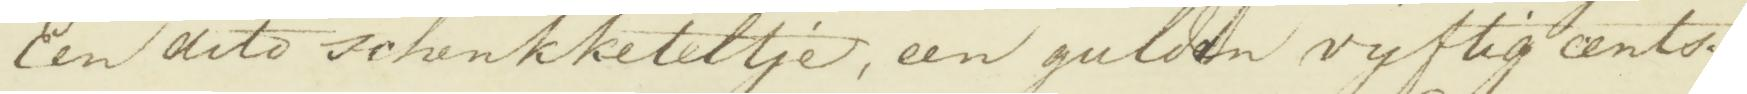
Een dito schenkketeltje, een gulden vyftig cents.
